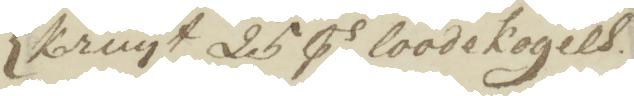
{ kruijt 25 p„s loode kogels.
